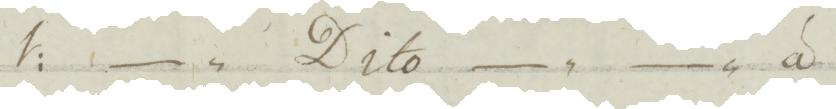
1: —„ Dito —„ —„ a
